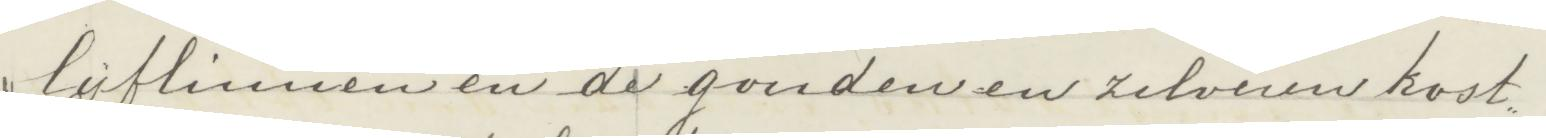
lijflinnen en de gouden en zilveren kost„
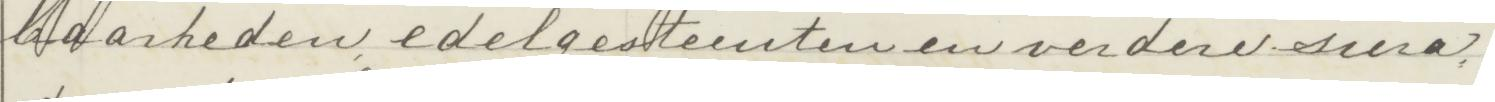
baarheden, edelgesteenten en verdere siera,
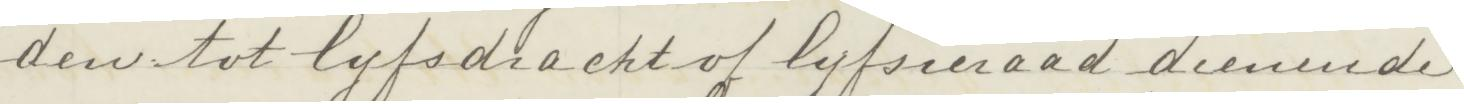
den tot lyfsdracht of lyfsieraad dienende
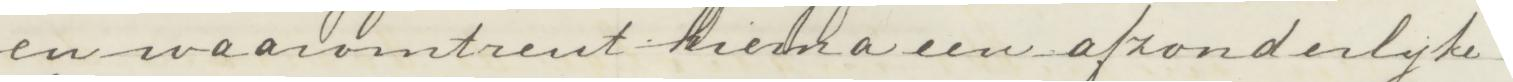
en waaromtrent hierna eenafzonderlijke
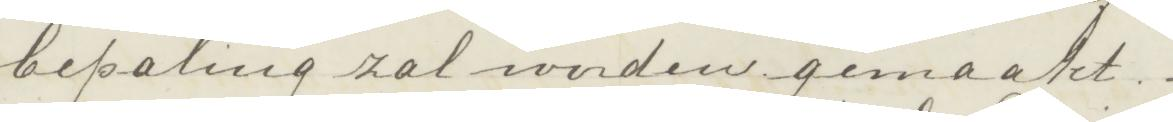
bepaling zal worden gemaakt.
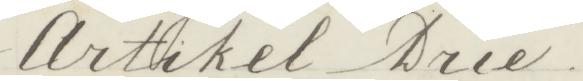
Artikel Drie
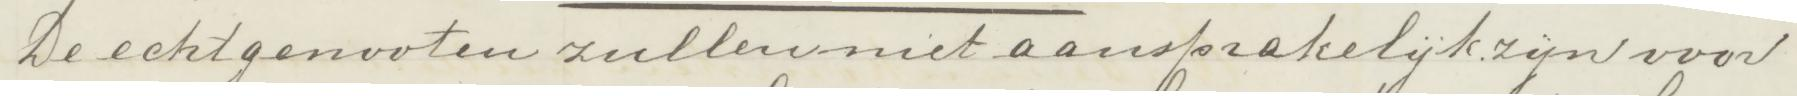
De echtgenooten zullen niet aansprakelijk zijn voor
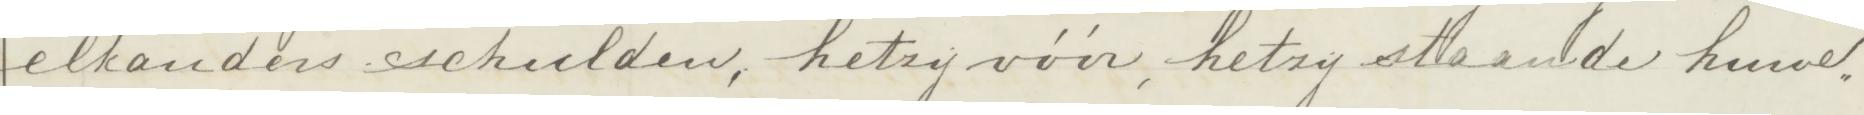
elkanders schulden, hetzij vóór, hetzij staande huwe„
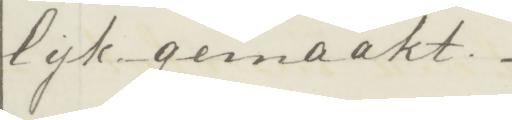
lijk gemaakt.
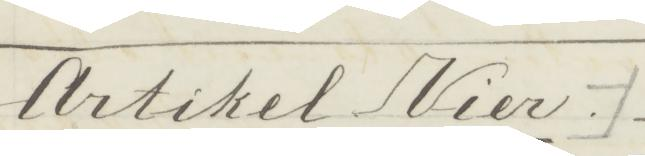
Artikel Vier.]
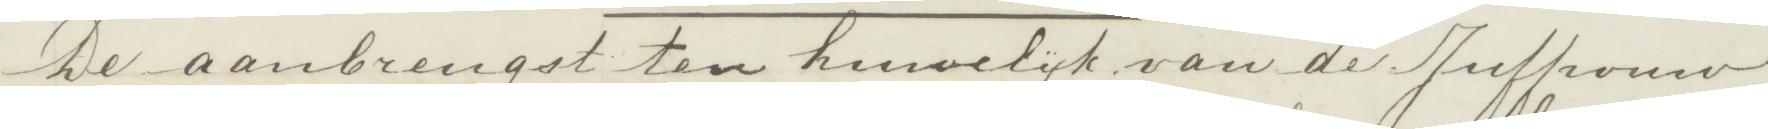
De aanbrengst ten huwelijk van de Juffrouw
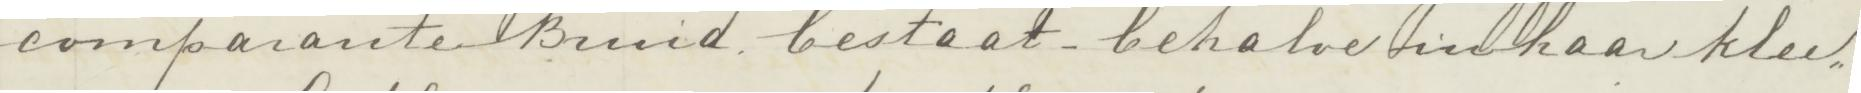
comparante Bruid, bestaat- behalve in haar klee„
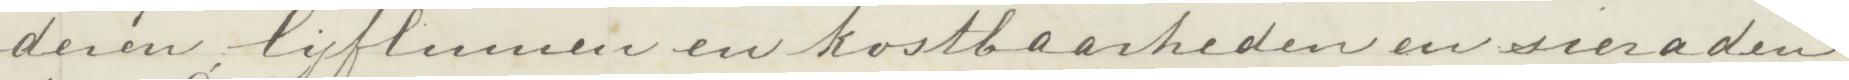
deren, lijflinnen en kostbaarheden en sieraden
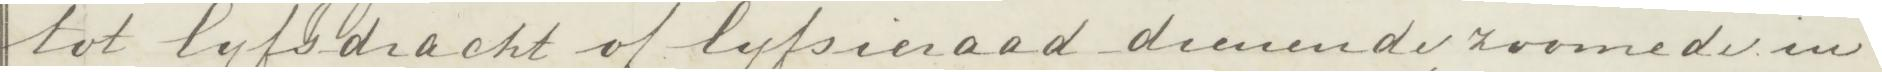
tot lyfsdracht of lyfsieraad dienende, zoomede in
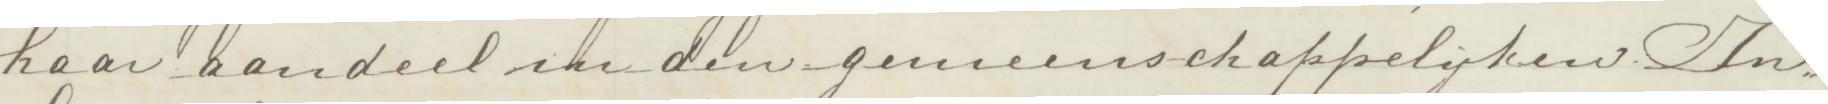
haar aandeel in den gemeenschappelijken In„
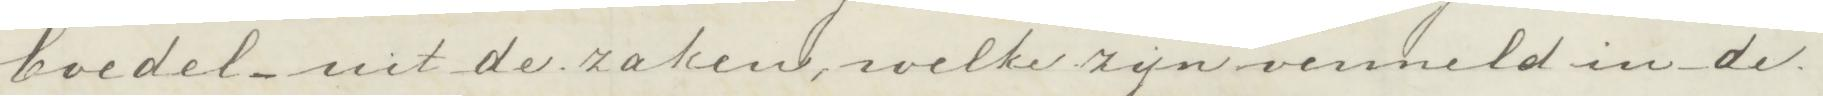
boedel- uit de zaken, welke zijn vermeld in - de.
